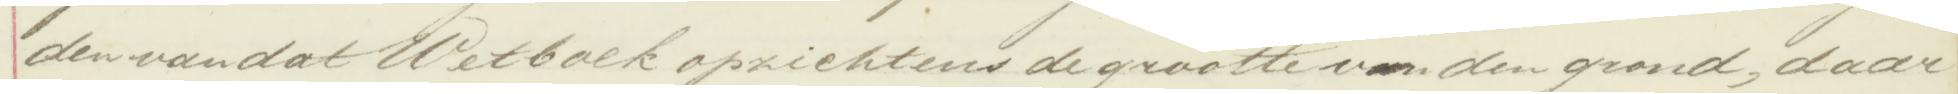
den van dat Wetboek opzichtens de grootte van den grond, daar
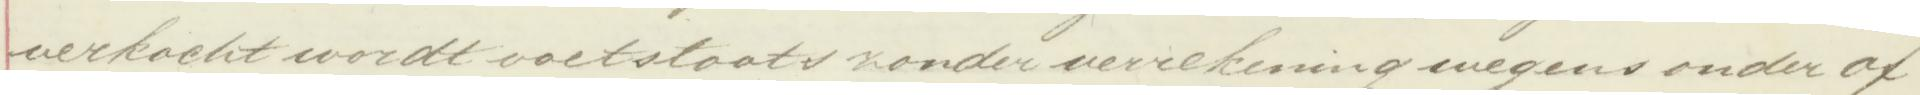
verkocht wordt voetstoots zonder verrekening wegens onder of
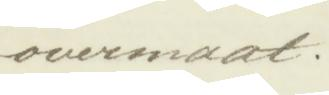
overmaat
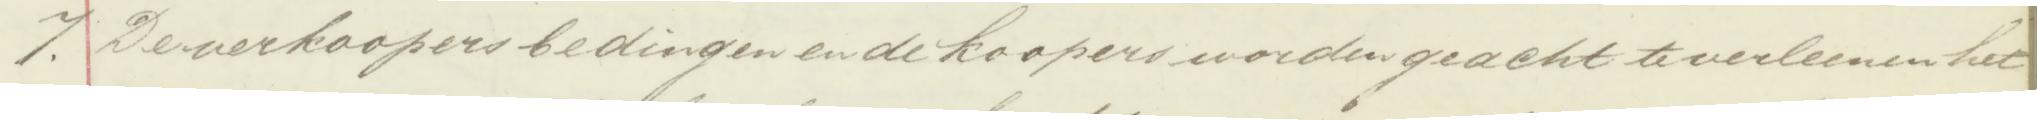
7. De verkoopers bedingen en de koopers worden geacht te verleenen het
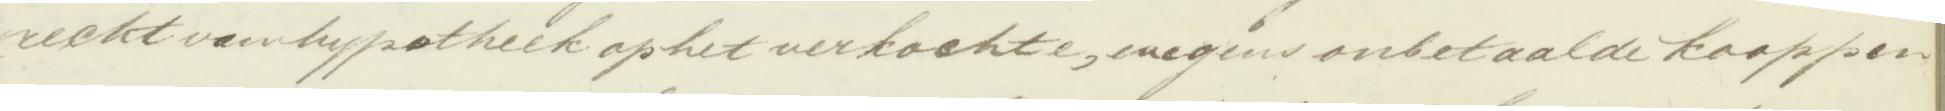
recht van hypotheek op het verkochten wegens onbetaalde kooppen
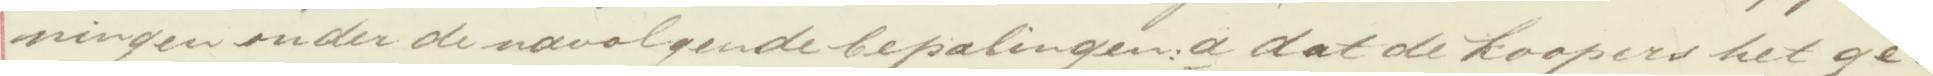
ningen onder de navolgende bepalingen: a dat de koopers het ge-
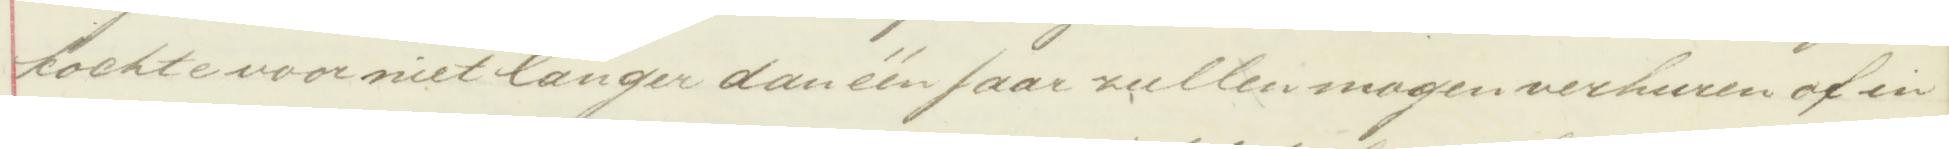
kochte voor niet langer dan een Jaar zullen mogen verhuren of in
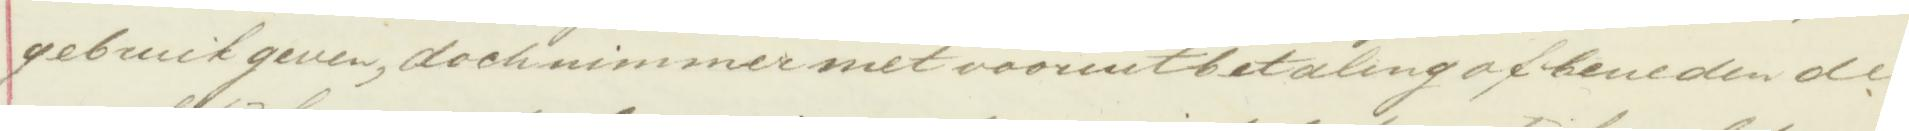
gebruik geven, doch nimmer met vooruitbetaling of beneden de
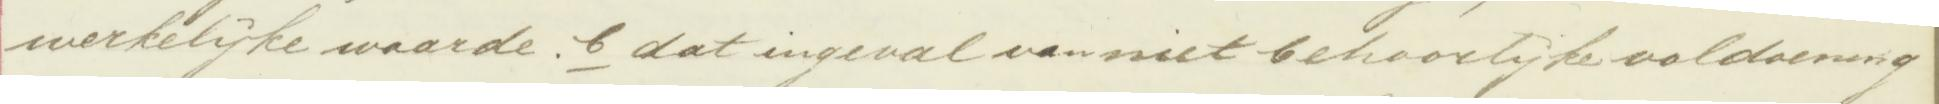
werkelijke waarde. b dat ingeval van niet behoorlijke voldoening
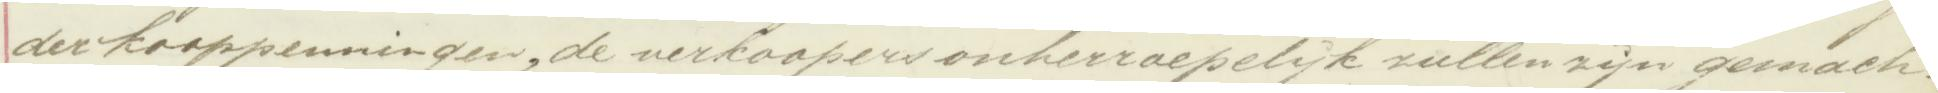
der kooppenningen, de verkoopers onherroepelijk zullen zijn gemach
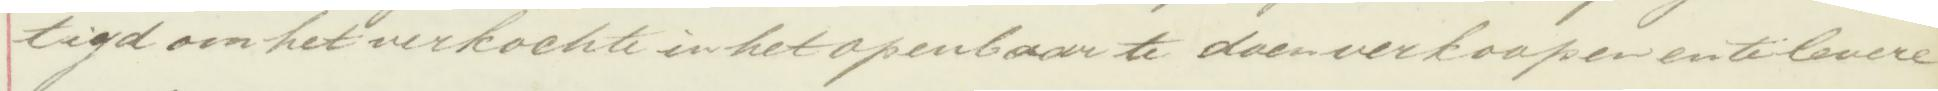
tigd om het verkochte in het openbaar te doen verkoopen en te levere
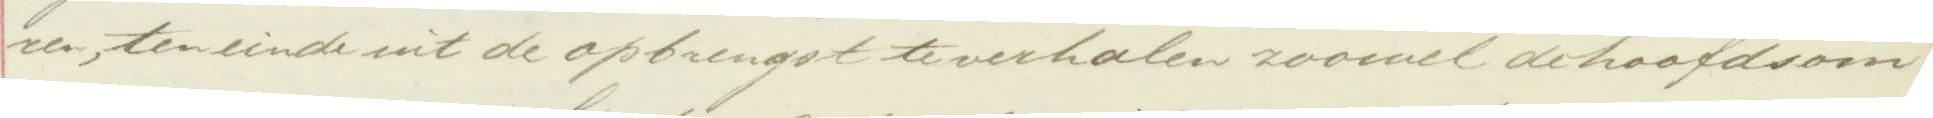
ren, ten einde uit de opbrengst te verhalen zoowel de hoofdsom
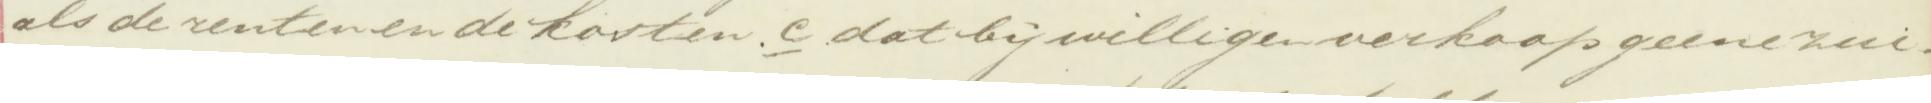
als de renten en de kosten. c dat bij willigen verkoop geene zui
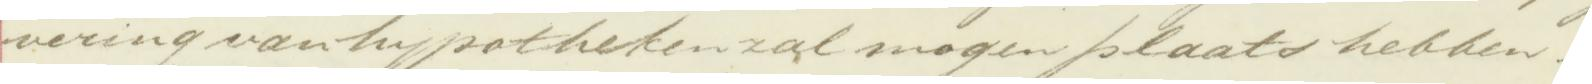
vering van hypotheken zal mogen plaats hebben.
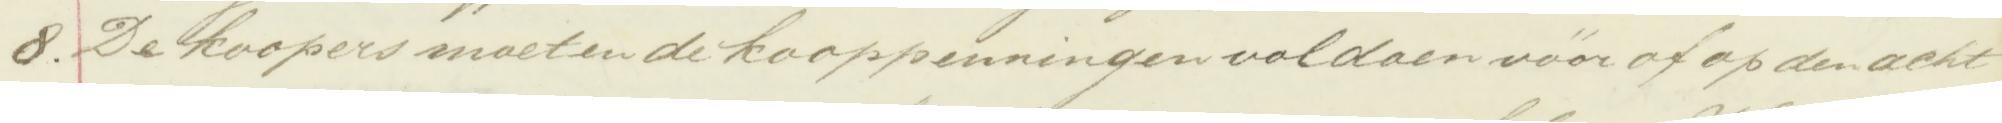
8. De koopers moeten de kooppenningen voldoen vóór of op den acht
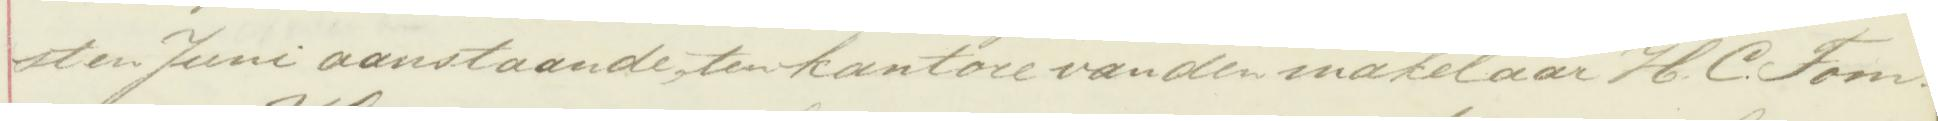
sten Juni aanstaande, ten kantore van den makelaar H. C. Fom„
